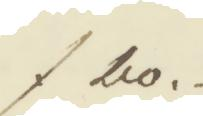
ƒ40.
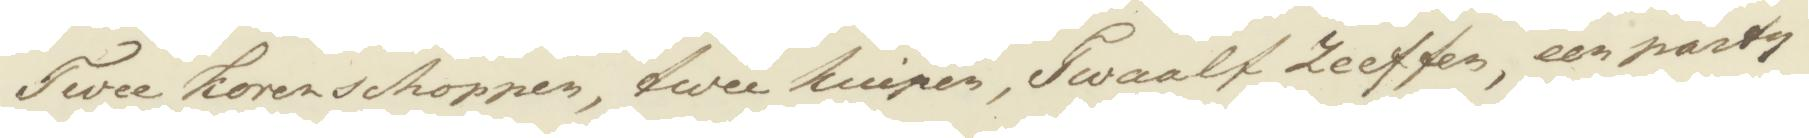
Twee Korenschoppen, twee kuipen, Twaalf Zeeffen, een party
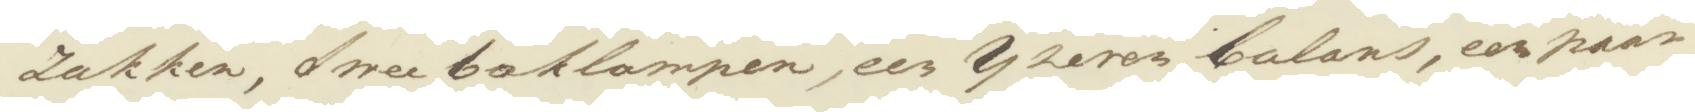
zakken, twee baklampen, een yzeren balans, een paar
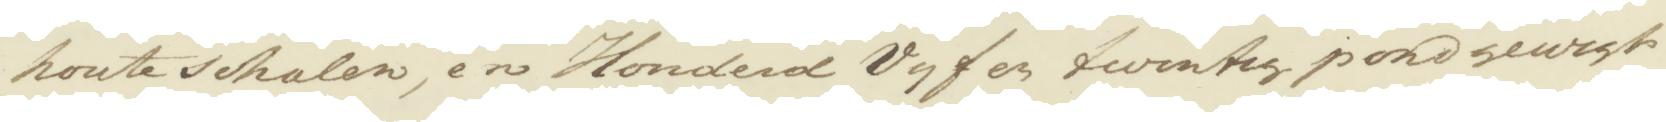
houte schalen, en Honderd Vyf en twintig pond gewigt
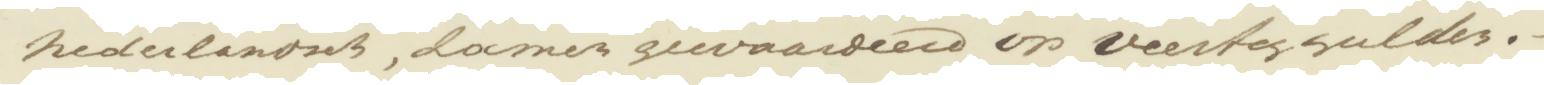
nederlandsch, zamen gewaardeerd op veertig gulden.
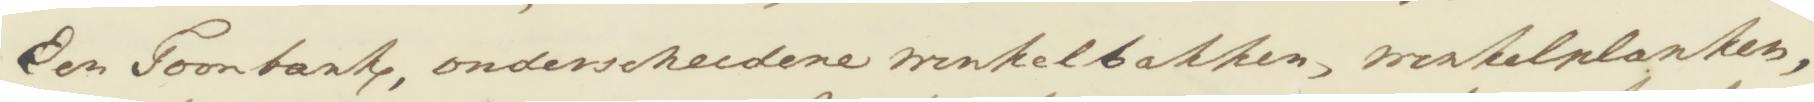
Een Toonbank, onderscheidene winkelbakken winkelplanken,
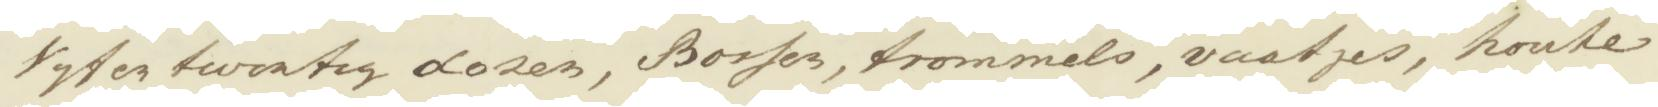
Vyf en twintig dozen, Bossen, trommels, vaatjes, houte
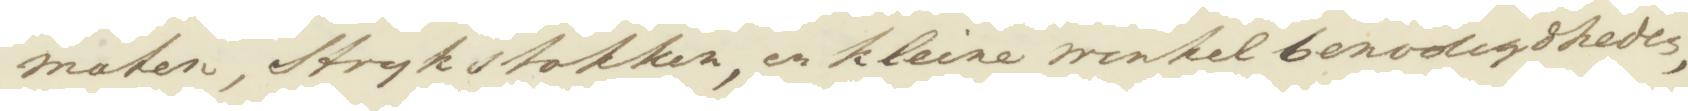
maten, stryk stokken, en kleine winkel benodigdheden,
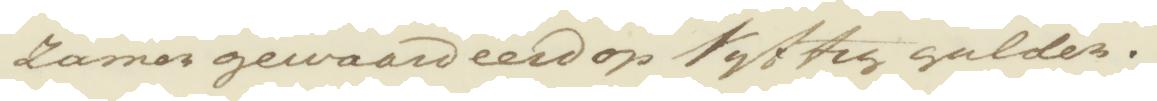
zamen gewaardeerd op Vyftig gulden.
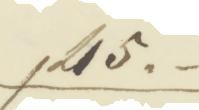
45„ -
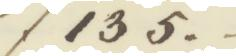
ƒ 135„
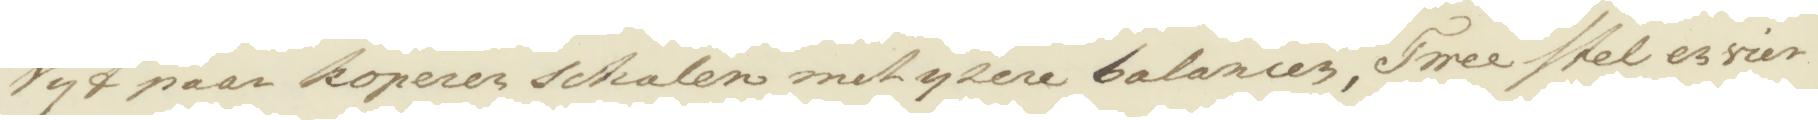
Vyf paar koperen schalen met yzere balancen, Twee stel en vier
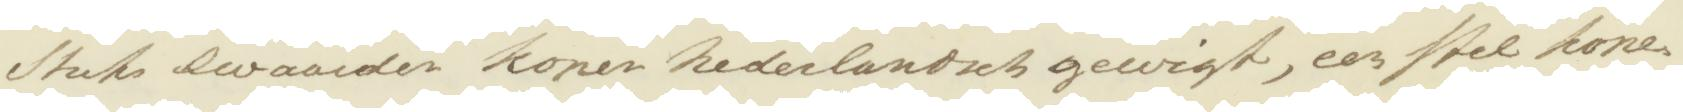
stuks zwaarder koper nederlandsch gewigt, een stel kope
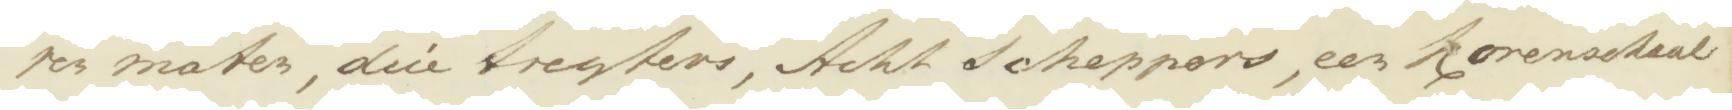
ren maten, drie tregters, Acht scheppers, een Korenschaal
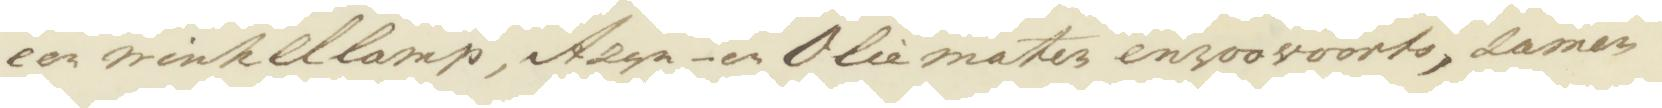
een winkellamp, Azyn - en Olie maten enzoovoorts, zamen
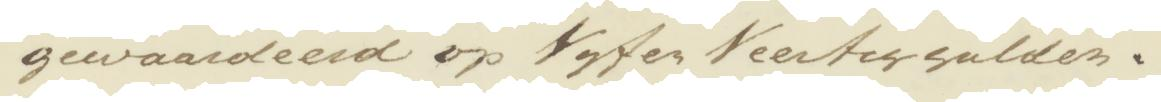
gewaardeerd op Vyfen Veertig gulden.
